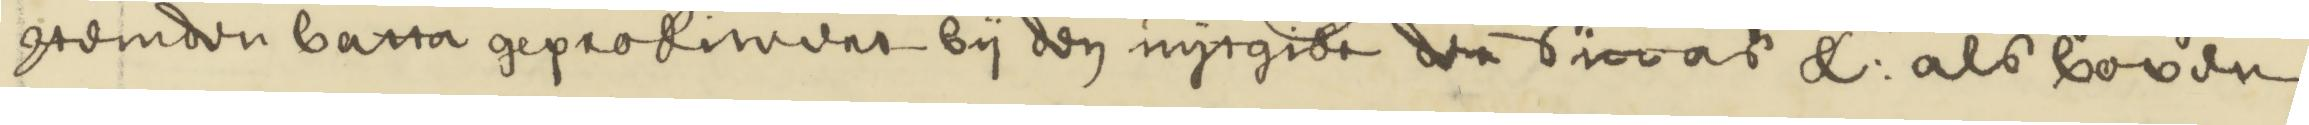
jtem den batta geprofiteert bij den uijtgift der siccas &: als boven
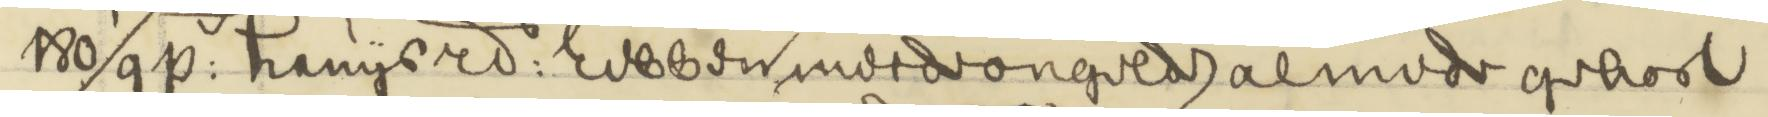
180¼ p:s kruijs rd:s hebben met de ongelden almede gekost
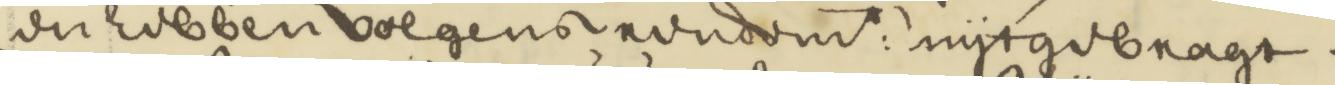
en hebben volgens rendem:t uijtgebragt
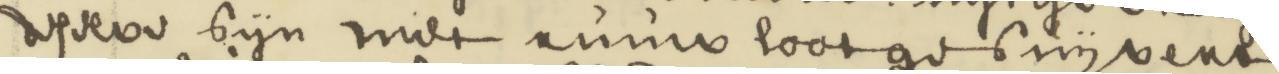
deselve sijn met ruuw loot gesuijvert
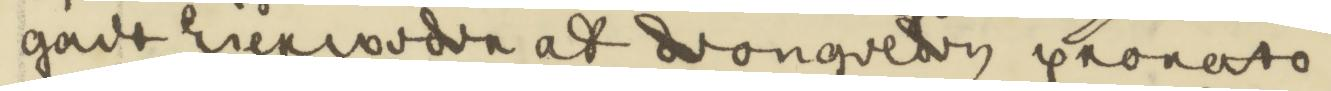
gaet hier weder af de ongelden prorato
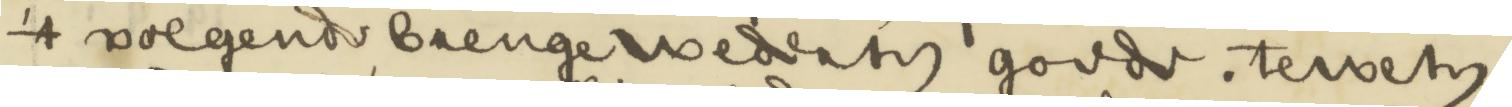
’t volgende brenge weder ten goede. te weten
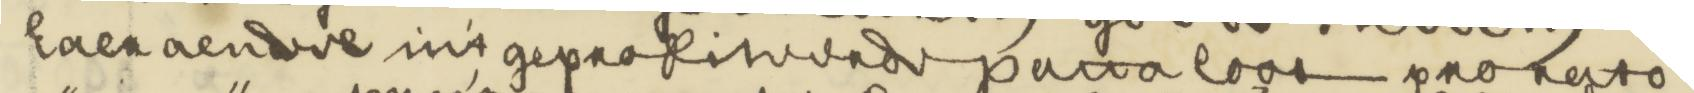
haer aendeel in't geprofiteerde pacca loot pro rato
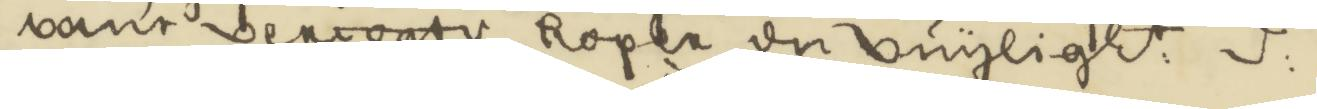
van't vercogte koper en vuijligh:t _:o
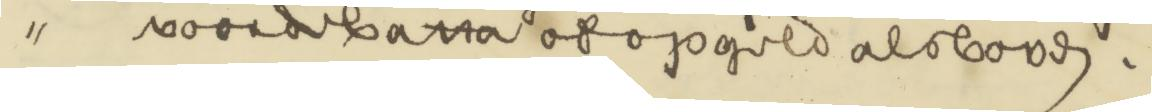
„ voor de batta of opgeld als boven .
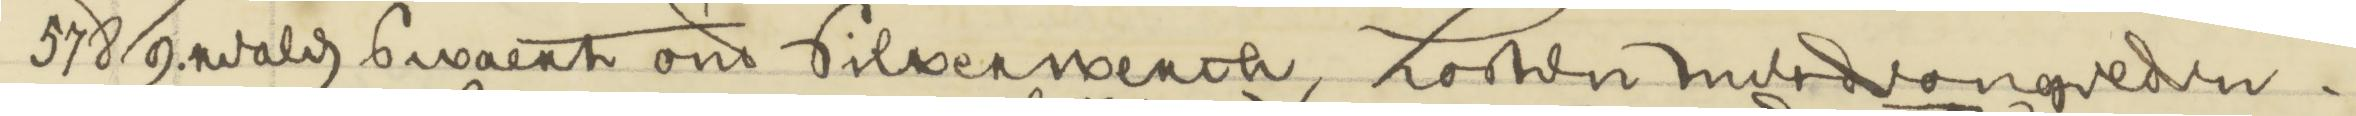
578 5/8. realen swaert oud silverwerck, kosten met de ongelden
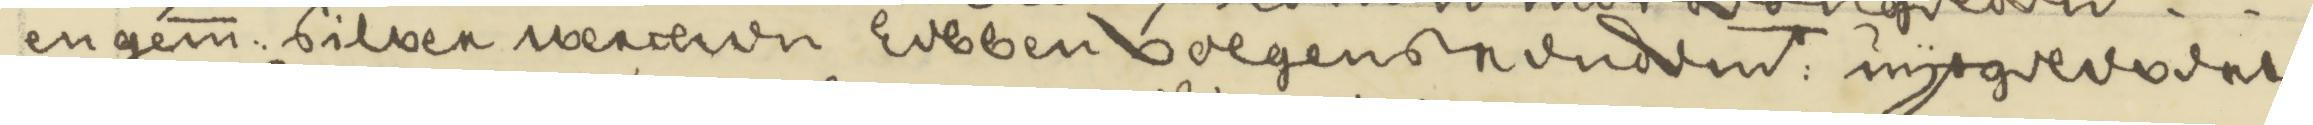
en gem: silver wercken hebben volgens rendem:t uijtgelevert
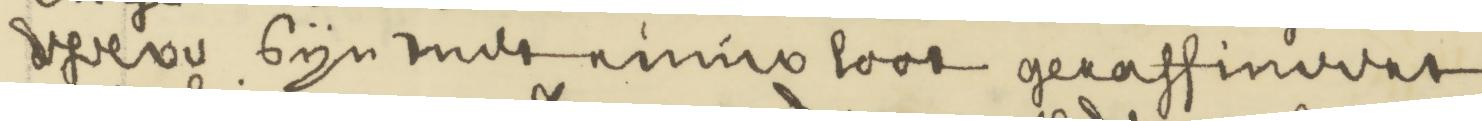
deselve sijn met ruuw loot geraffineert
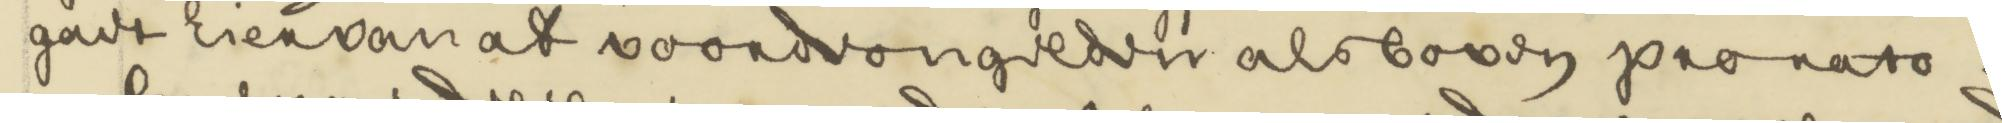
gaet hier van af voorde ongelden als boven pro rato
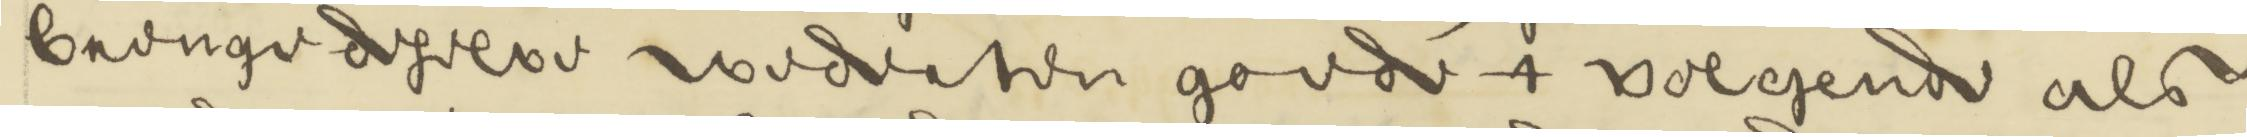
brenge deselve weder ten goede t volgende als
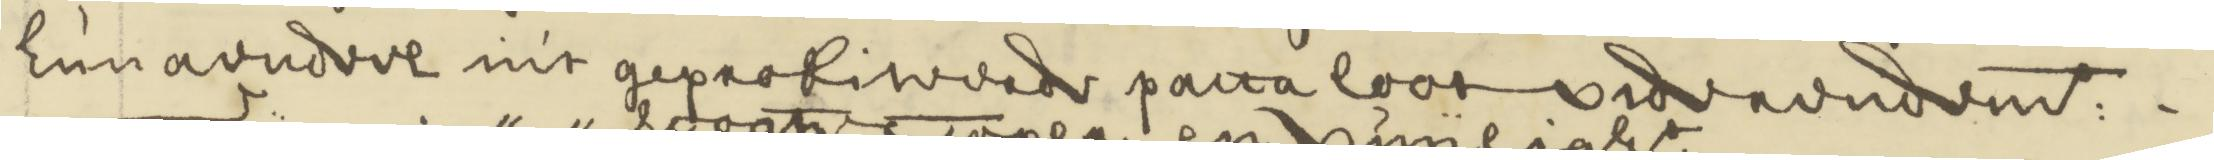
hun aendeel in't geprofiteerde pacca loot vide rendem:t
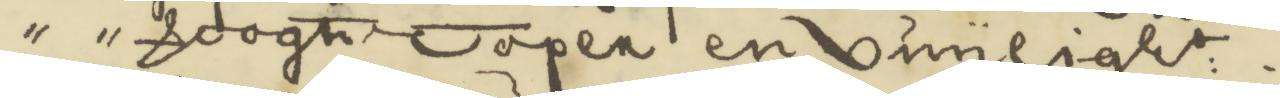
„ „ vercogt Coper en vuijligh:t
